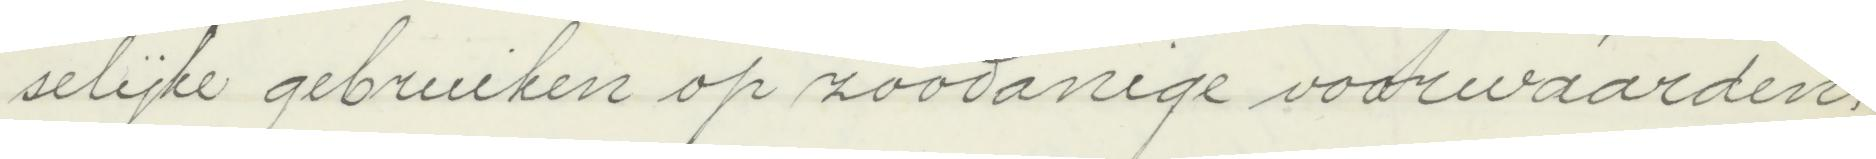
selijke gebruiken op zoodanige voorwaarden,
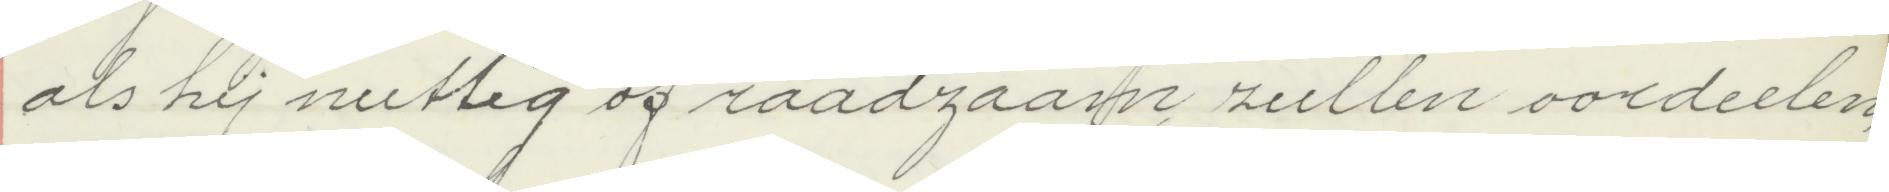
als hij nuttig of raadzaam, zullen oordeelen,
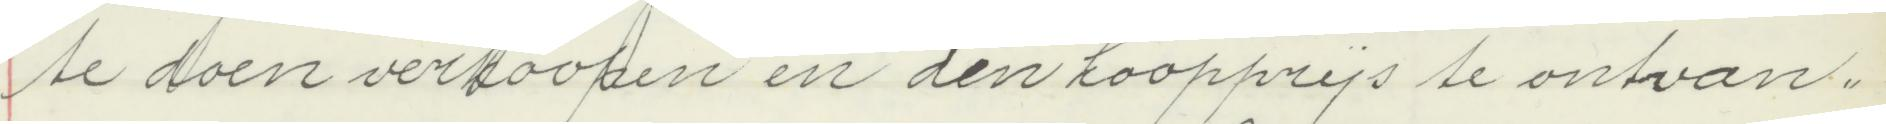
te doen verkoopen en den koopprys te ontvan„
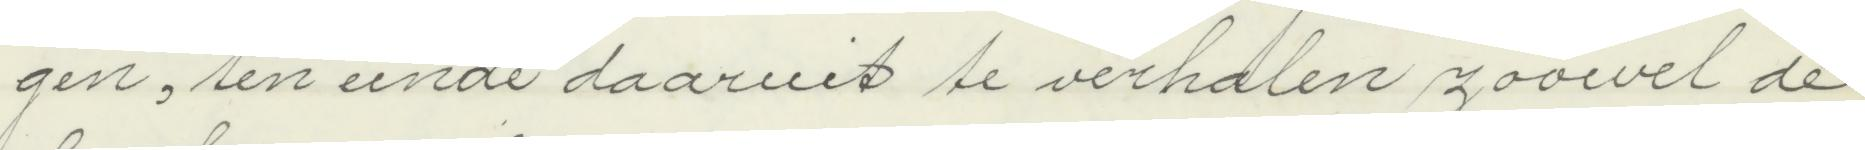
gen, ten einde daaruit te verhalen zoowel de
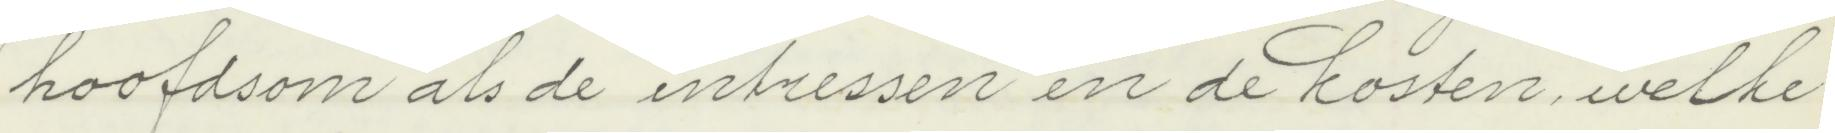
hoofdsom als de intressen en de kosten, welke
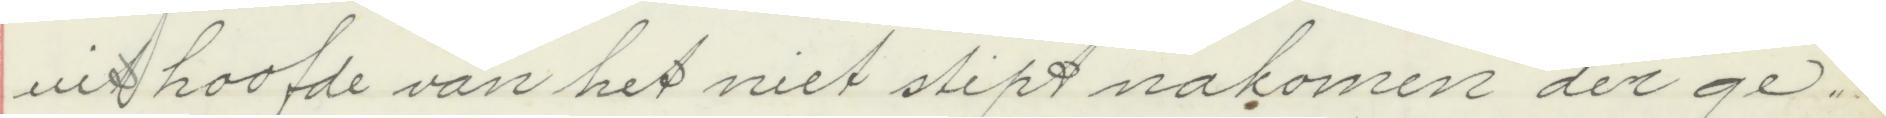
uit hoofde van het niet stipt nakomen der ge„
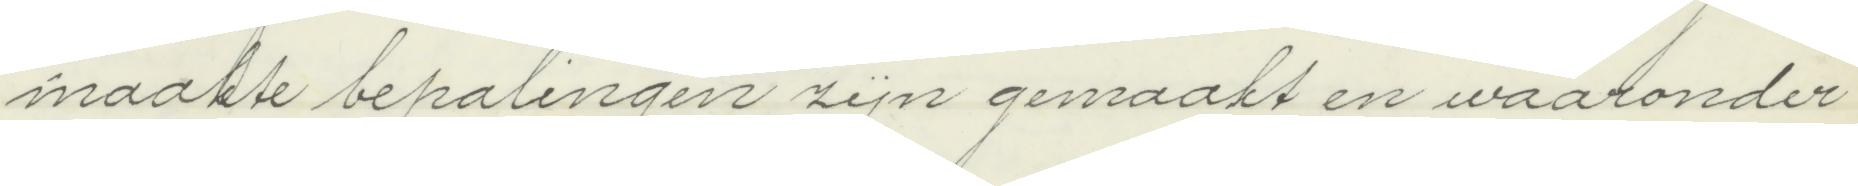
maakte bepalingen zijn gemaakt en waaronder
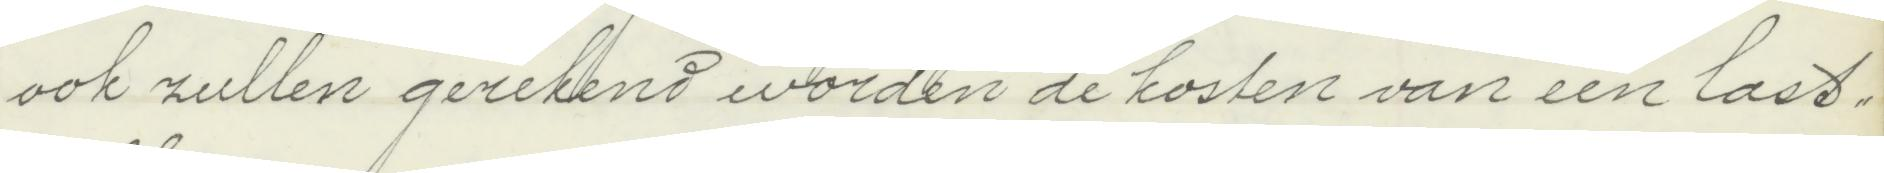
ook zullen gerekend worden de kosten van een last„
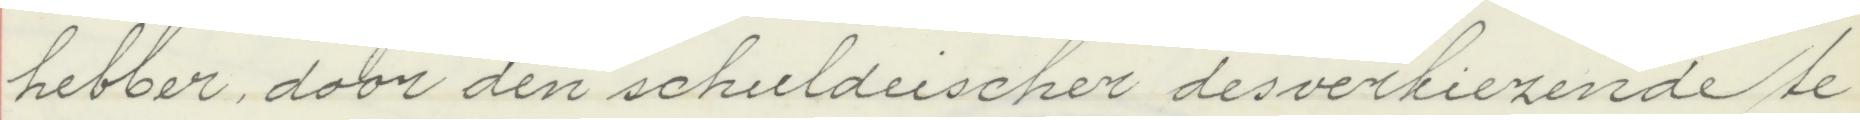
hebber, door den schuldeischer des verkiezende te
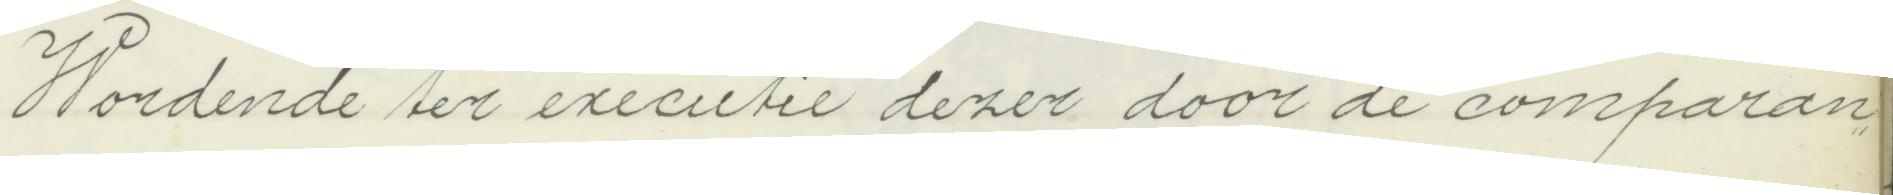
Wordende ter executie dezer door de comparan„
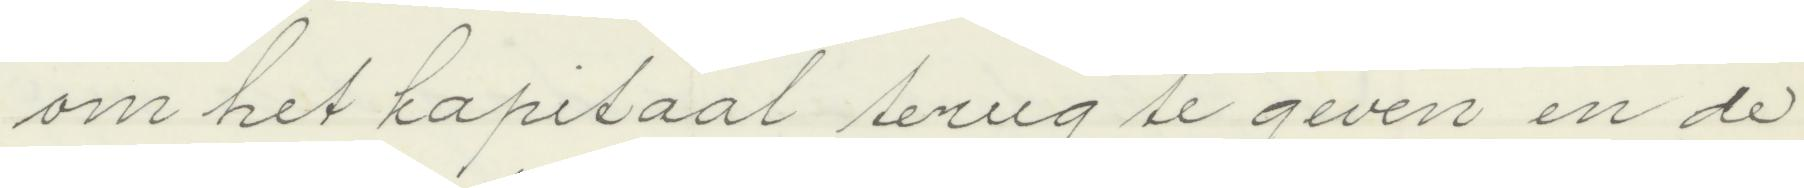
om het kapitaal terug te geven en de
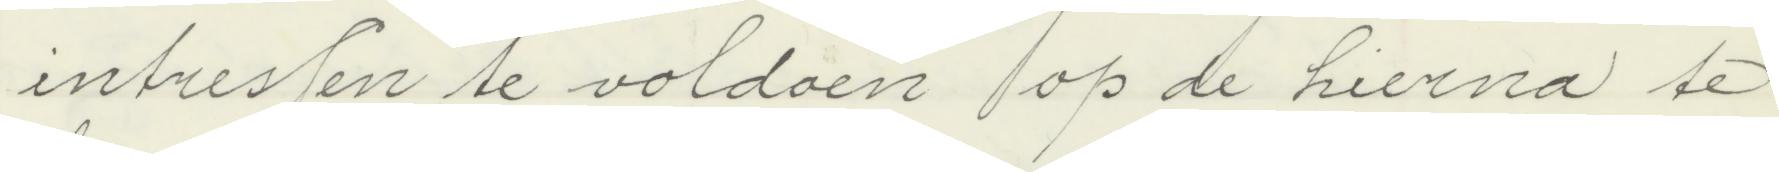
intressen te voldoen op de hierna te
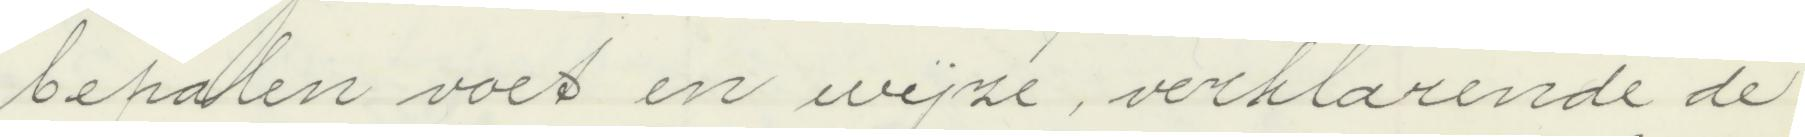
bepalen voet en wijze, verklarende de
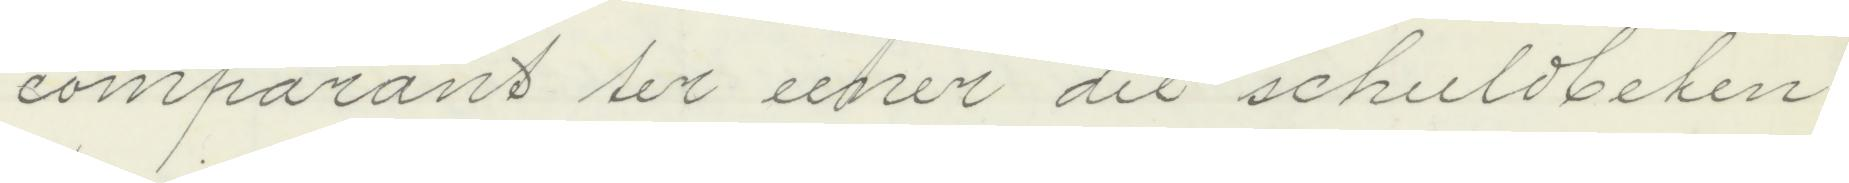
comparant ter eener die schuldbeken-
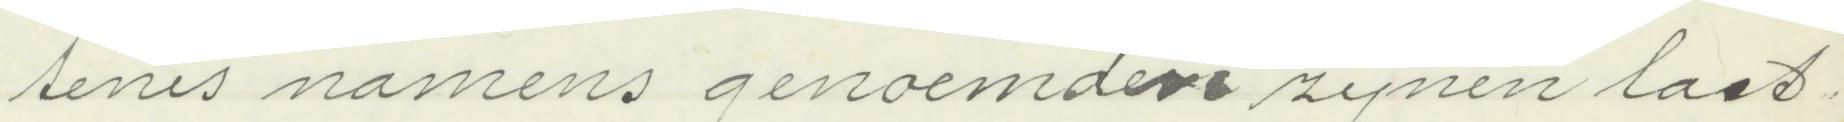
tenis namens genoemden zijnen last„
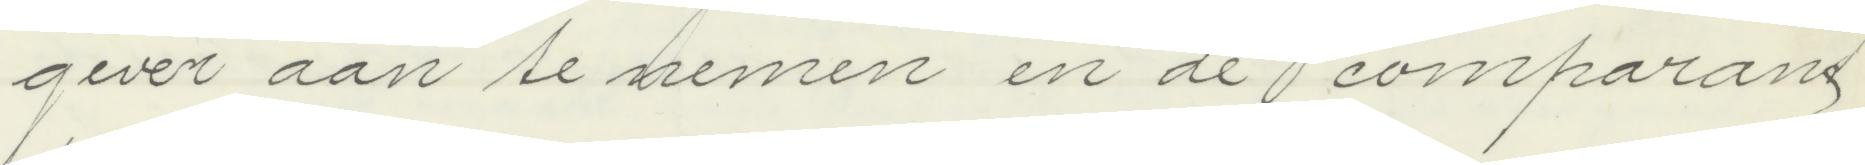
gever aan te nemen en de comparant
